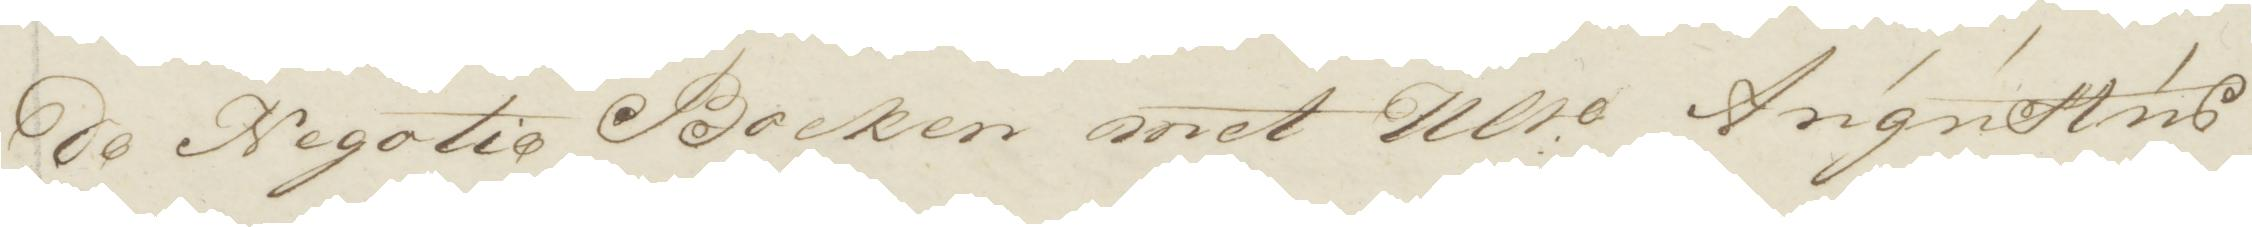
de Negotie Boeken met ult:o Augustus
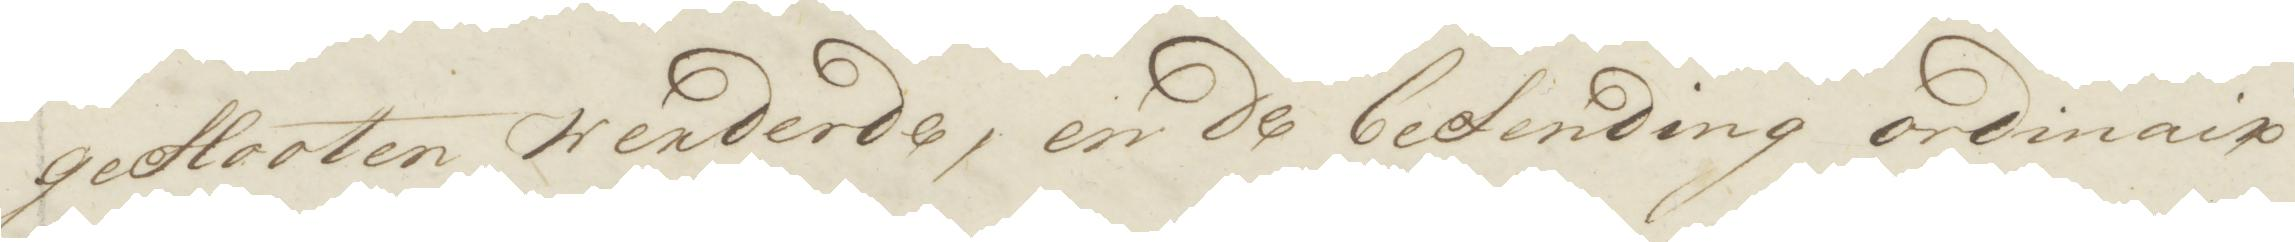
geslooten werderde, en de besending ordinair
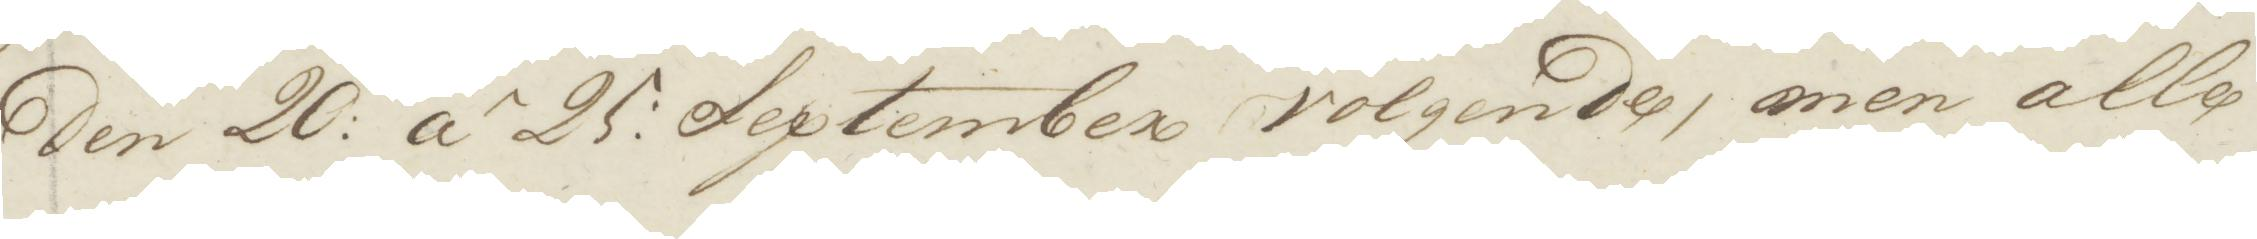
den 20: a ^ 25: September volgende, men alle
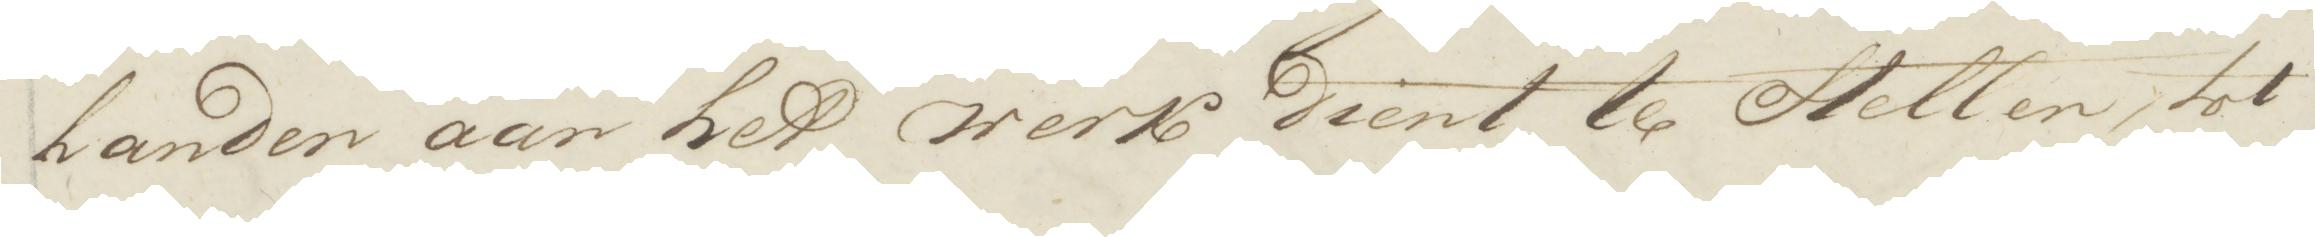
handen aan het werk dient te stellen, tot
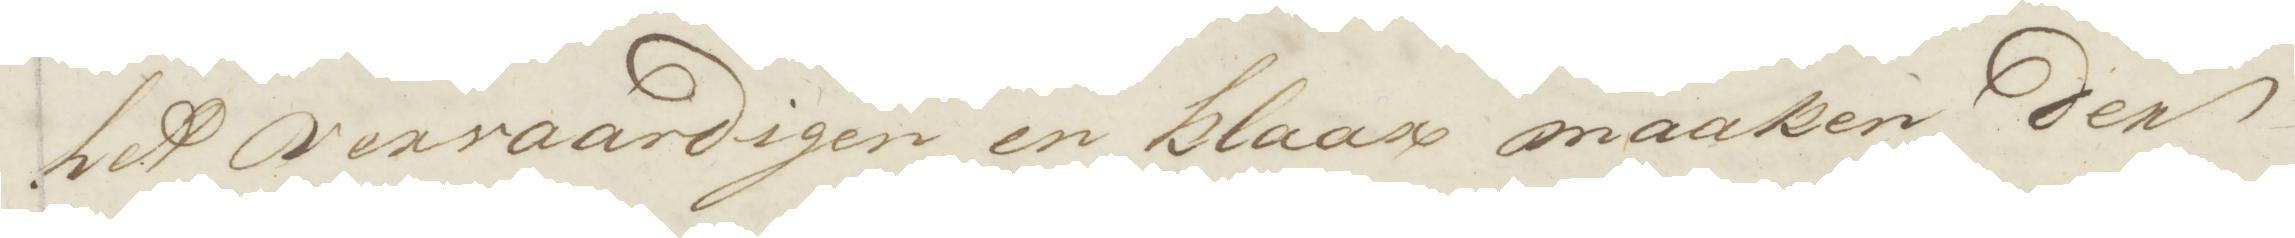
het vervaardigen en klaar maaken der
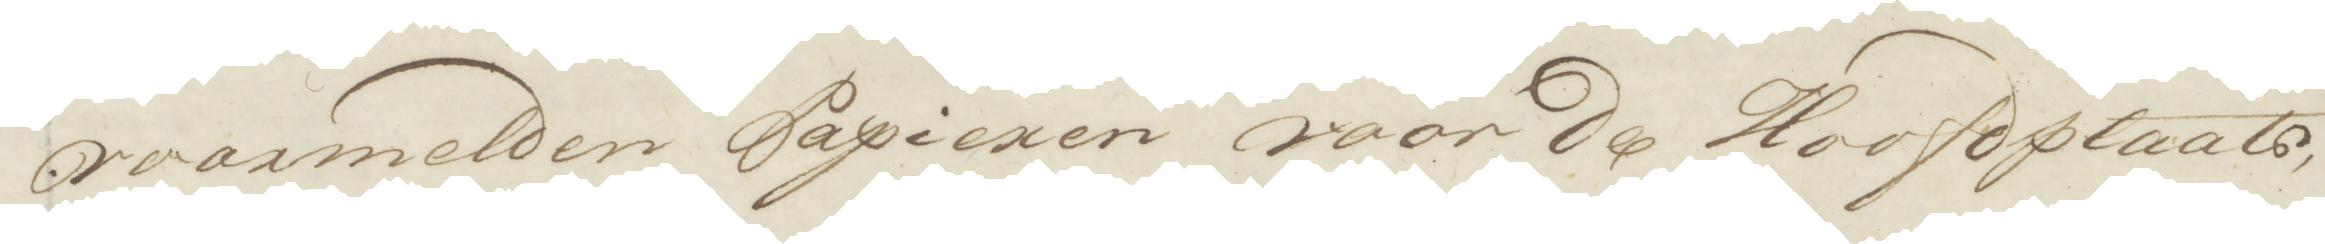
voormelden Papieren voor de Hoofdplaats,
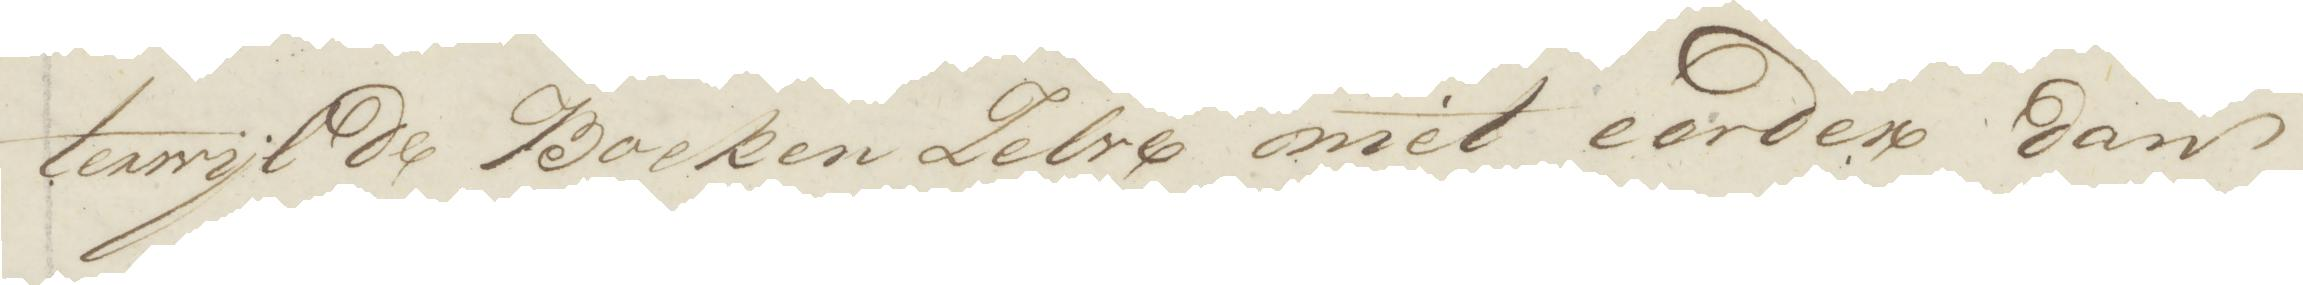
terwijl de Boeken zelve niet eerder dan
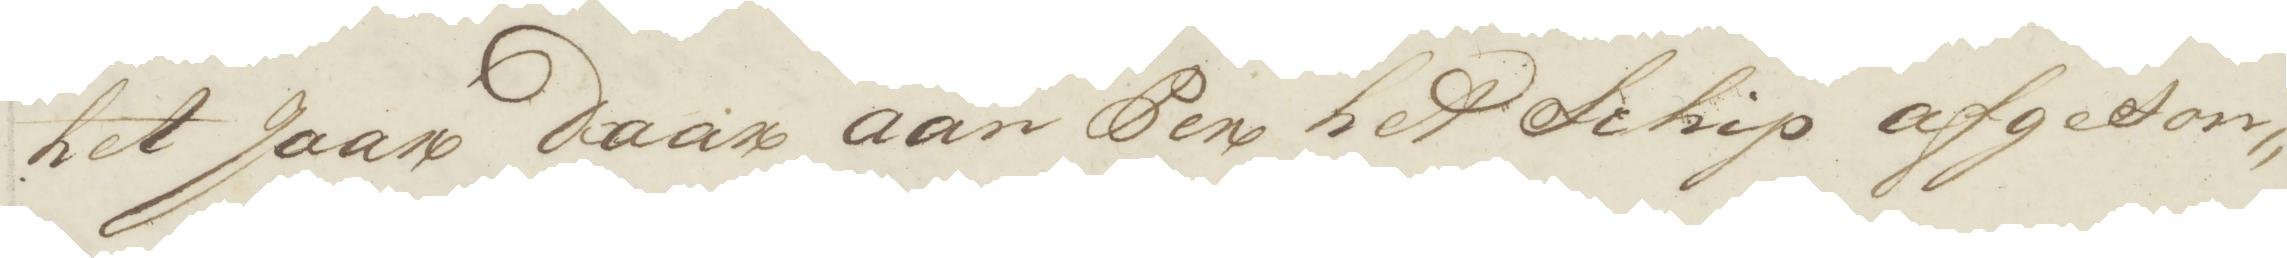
het Jaar daar aan Per het schip afgeson„
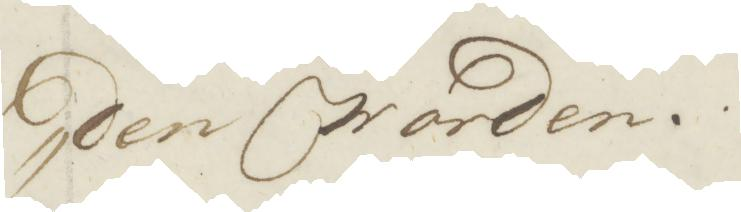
den worden.
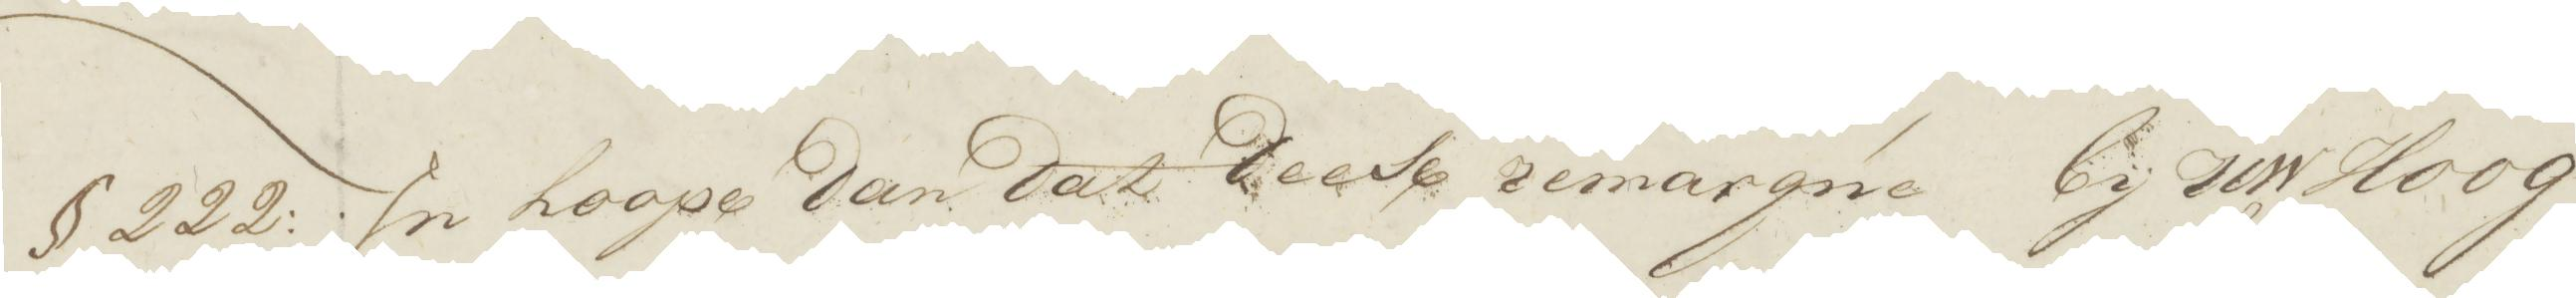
§ 222: In hoope dan dat deese remarque bij uw Hoog
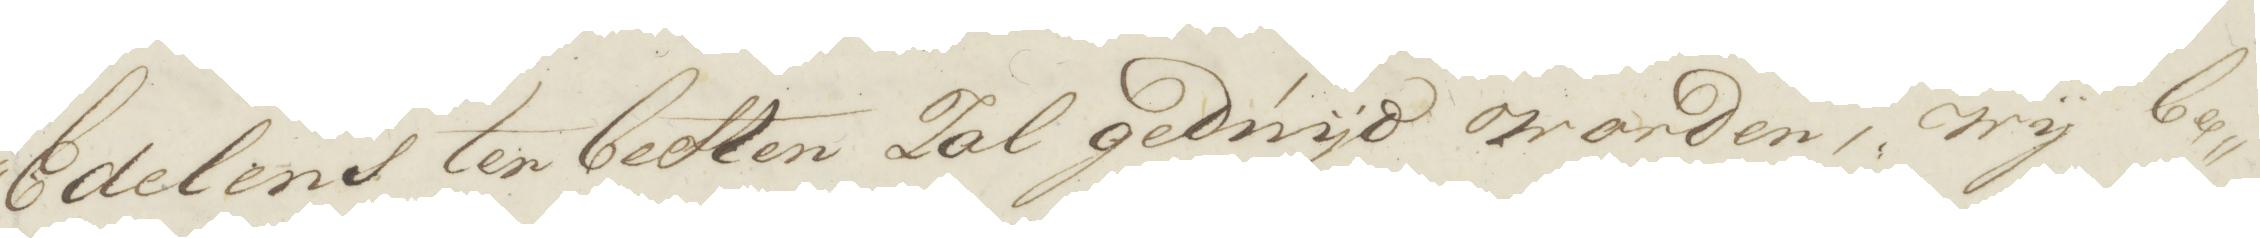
Edelens ten besten zal geduijd worden,„ wij be„
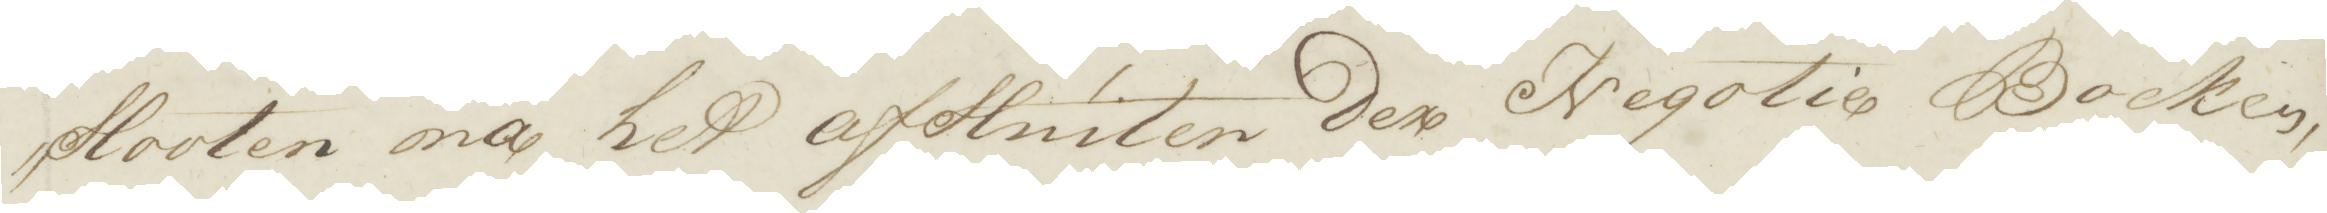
„slooten na het afsluiten der Negotie Boeken,
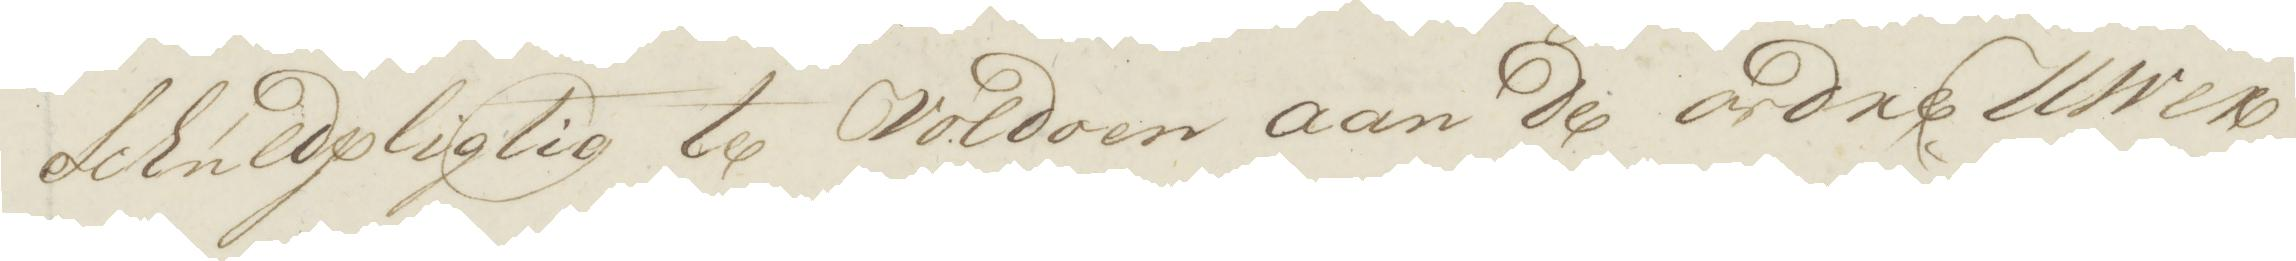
schuldpligtig te voldoen aan de ordre Uwer
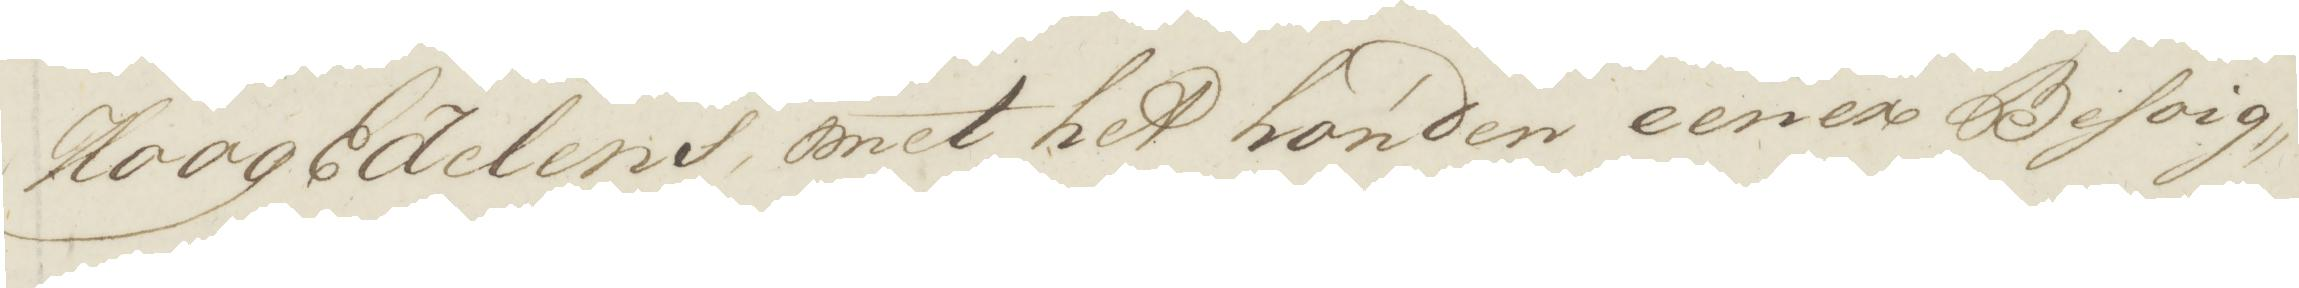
Hoog Edelens, met het houden eener Besoig„
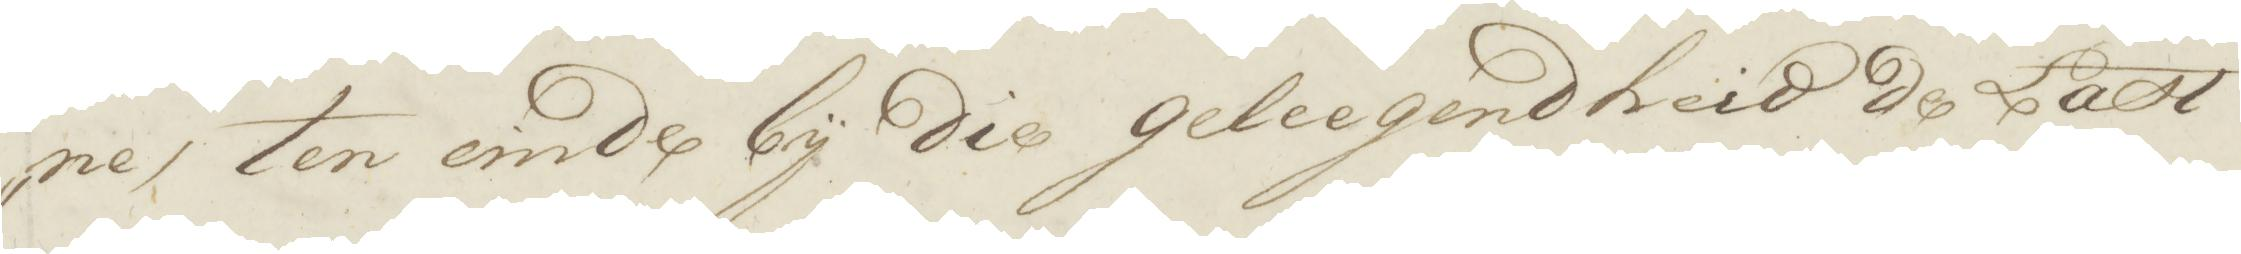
ne, ten einde bij die geleegendheid de Last
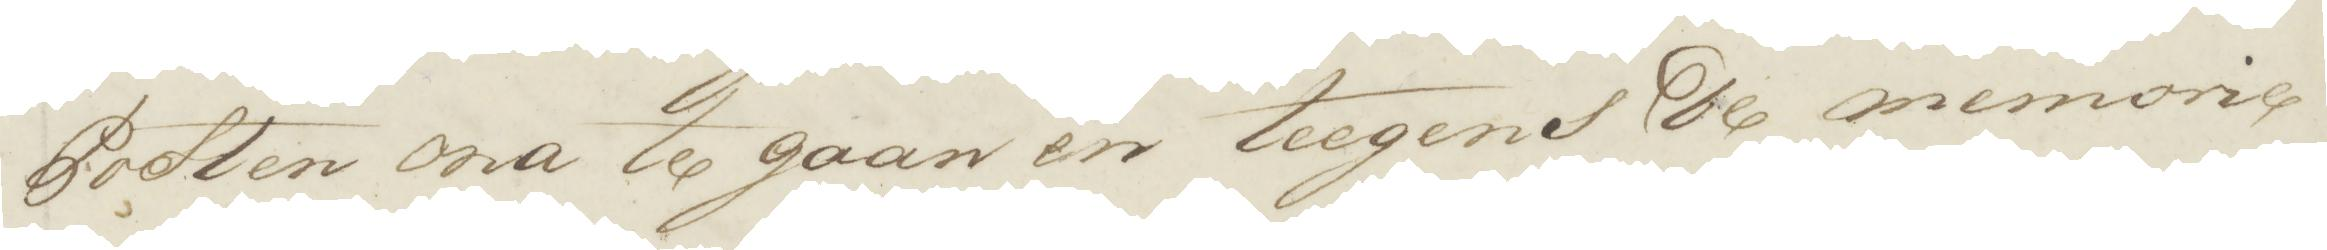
Posten na te gaan en teegens de memorie
